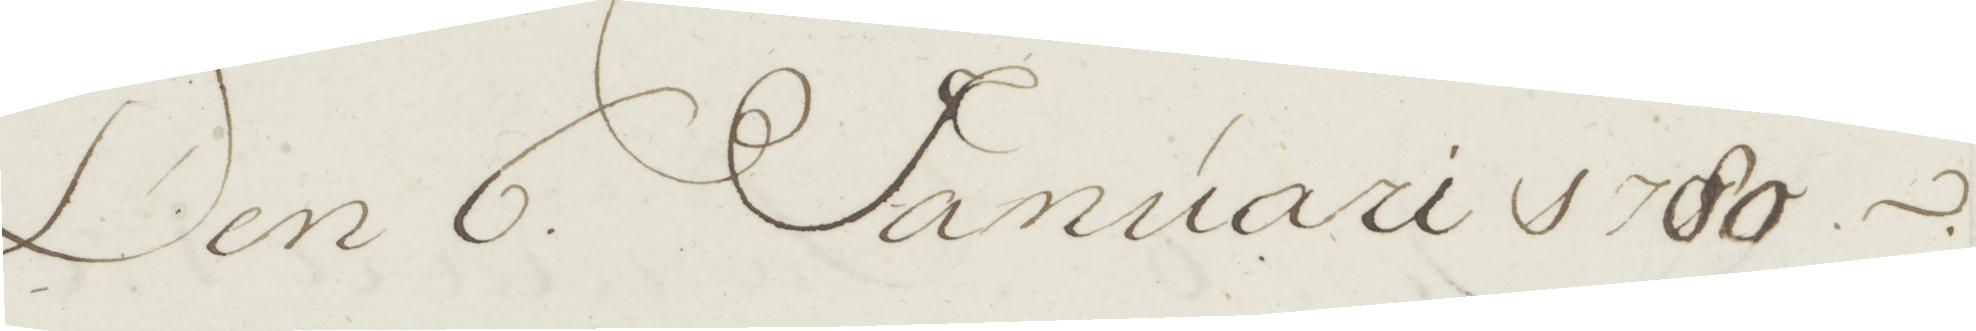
Den 6. Januari 1780.—.
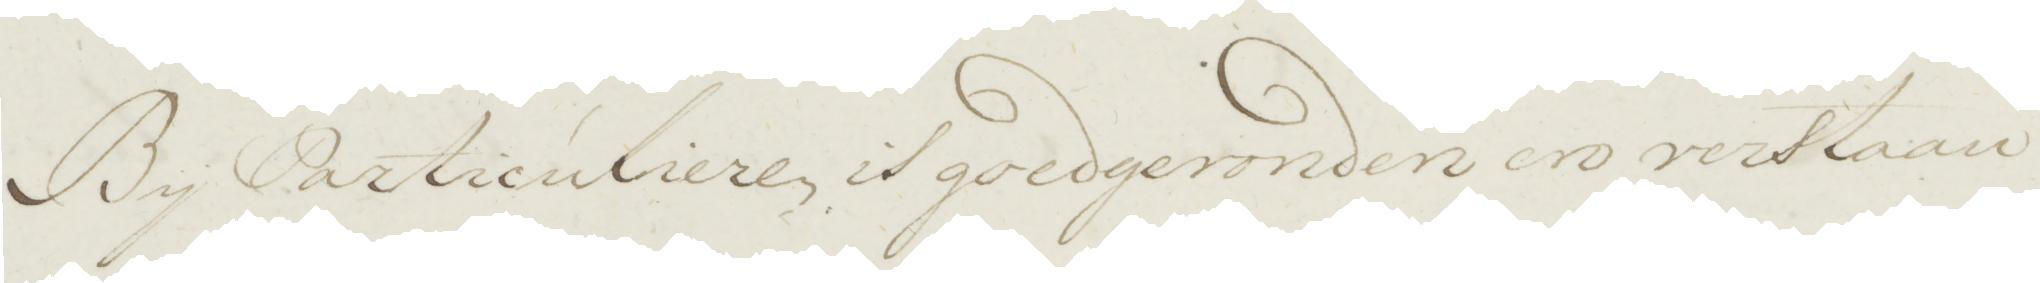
Bij Particulieren is goedgevonden en verstaan
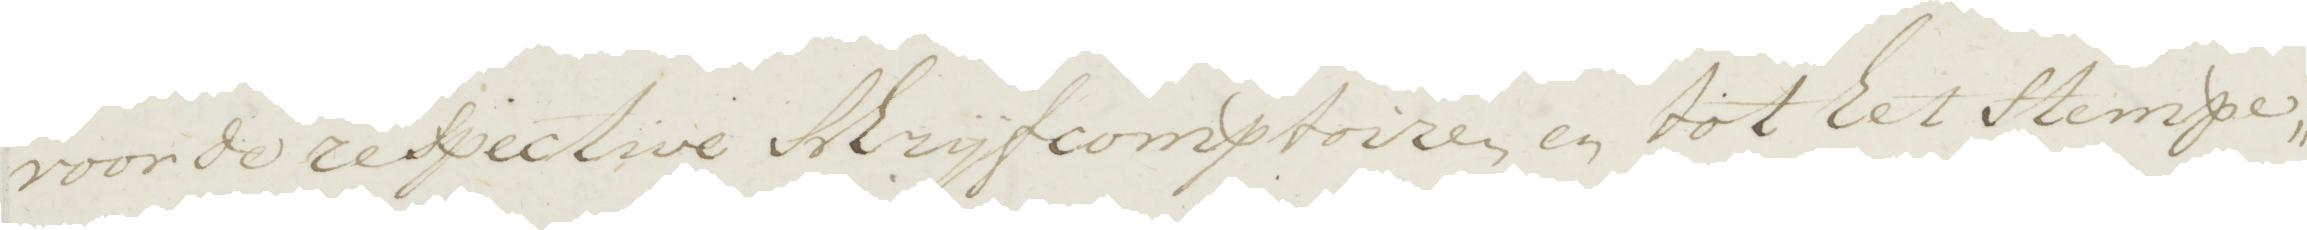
voor de respective schrijfcomptoiren en tot het stempe„
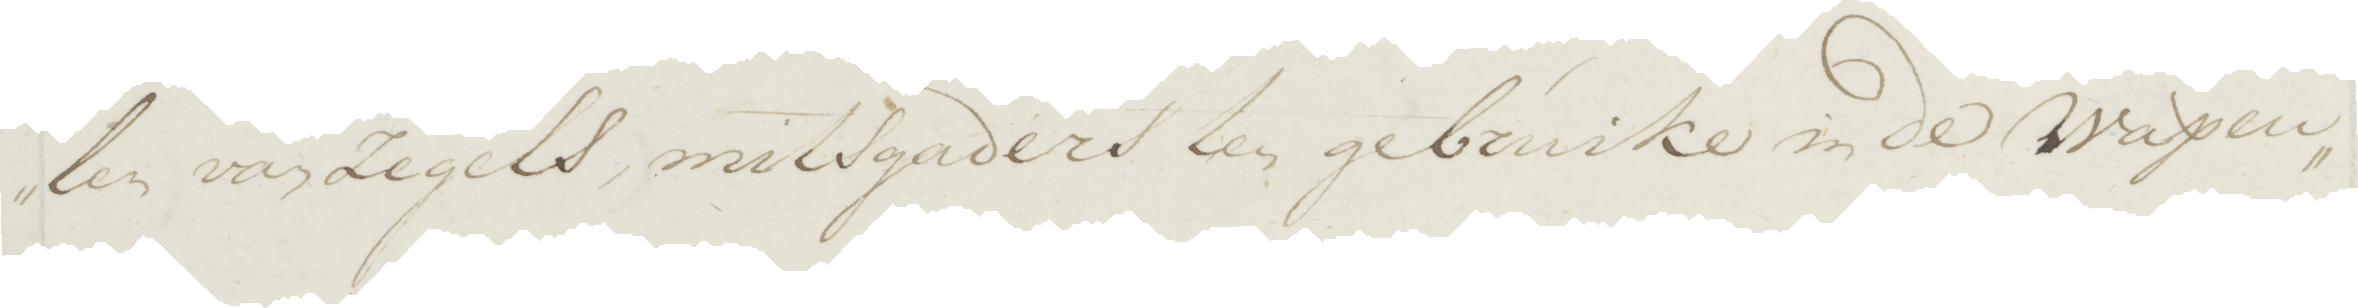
„len van zegels, mitsgaders ten gebruike in de wapen„
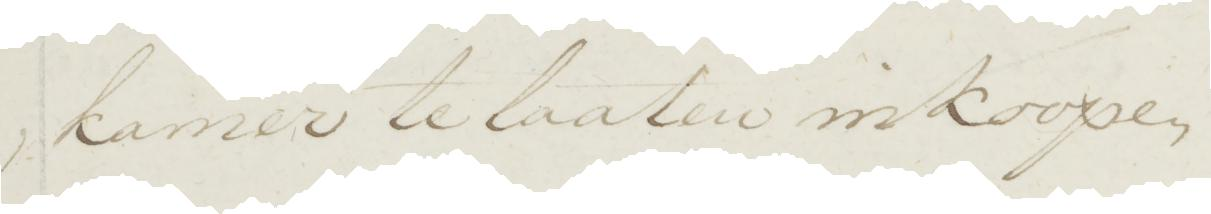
„kamer te laaten inkoopen
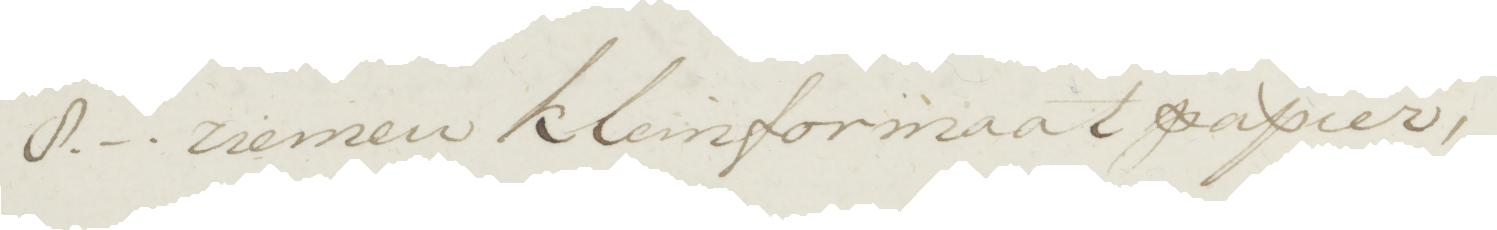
8.–. riemen kleinformaat papier,
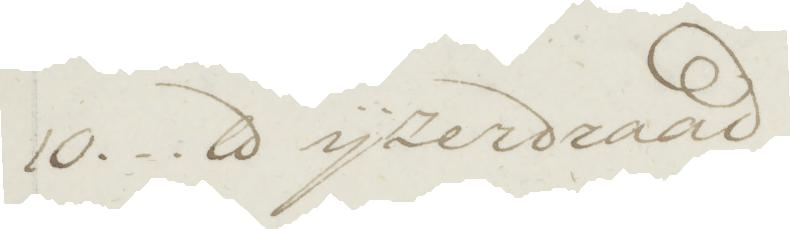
10.–. ld ijzerdraad,
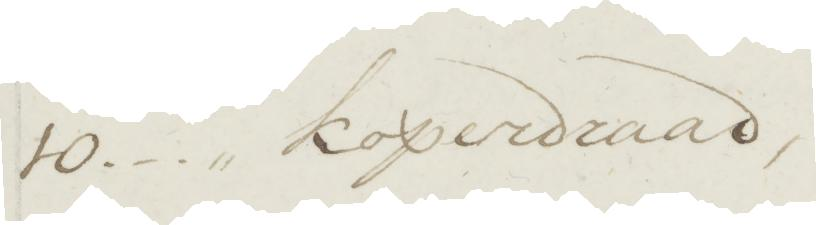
10.–.„ koperdraad,
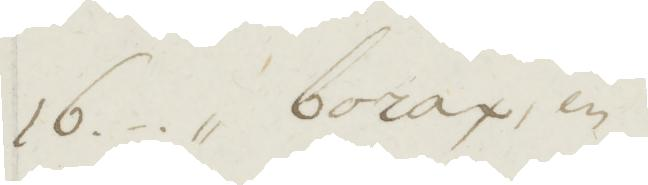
16.–.„ borax, en
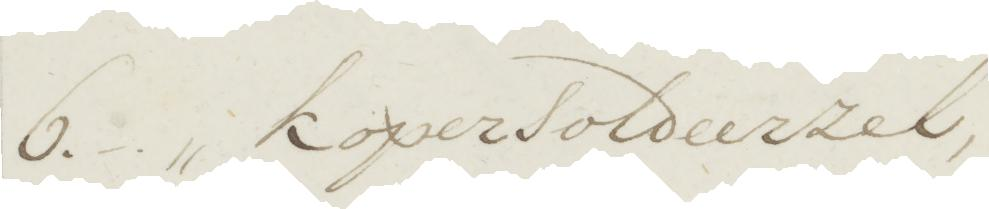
6.–. „ kopersoldeerzel,
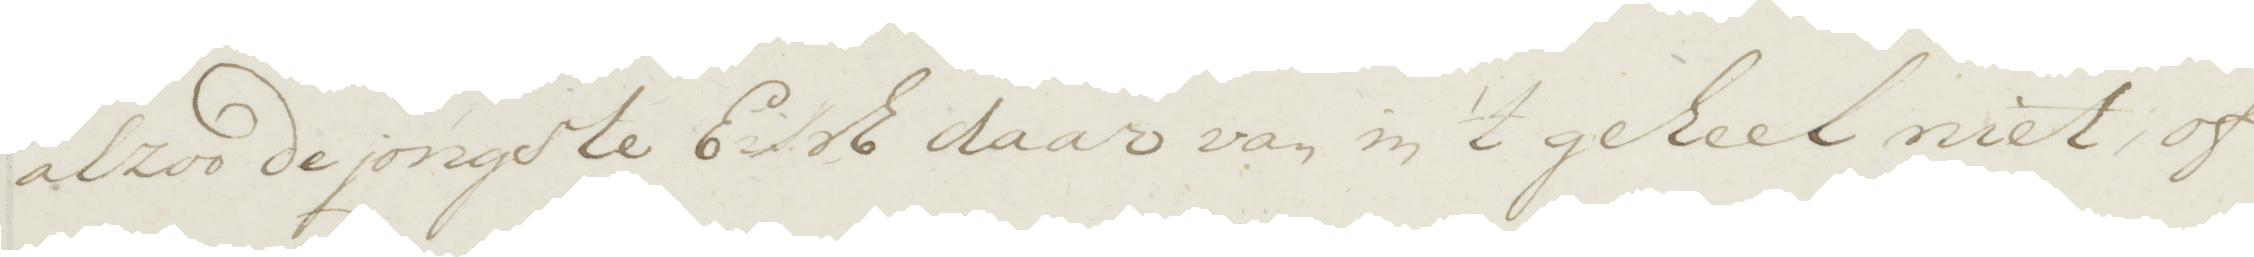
alzoo de jongste Eisch daar van in 't geheel niet, of
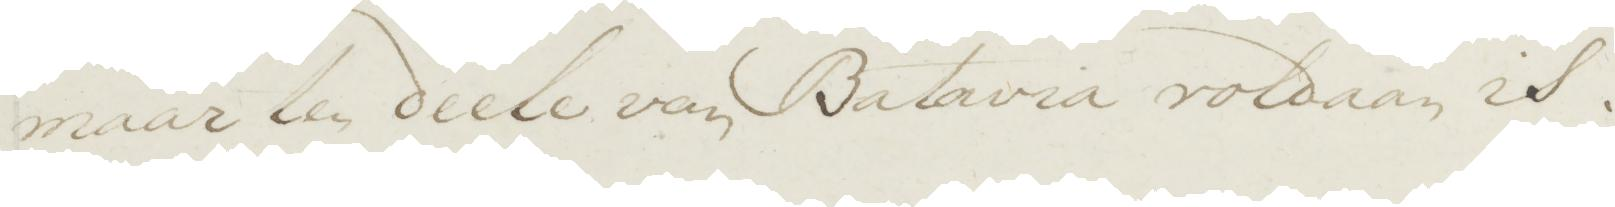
maar ten deele van Batavia voldaan is.
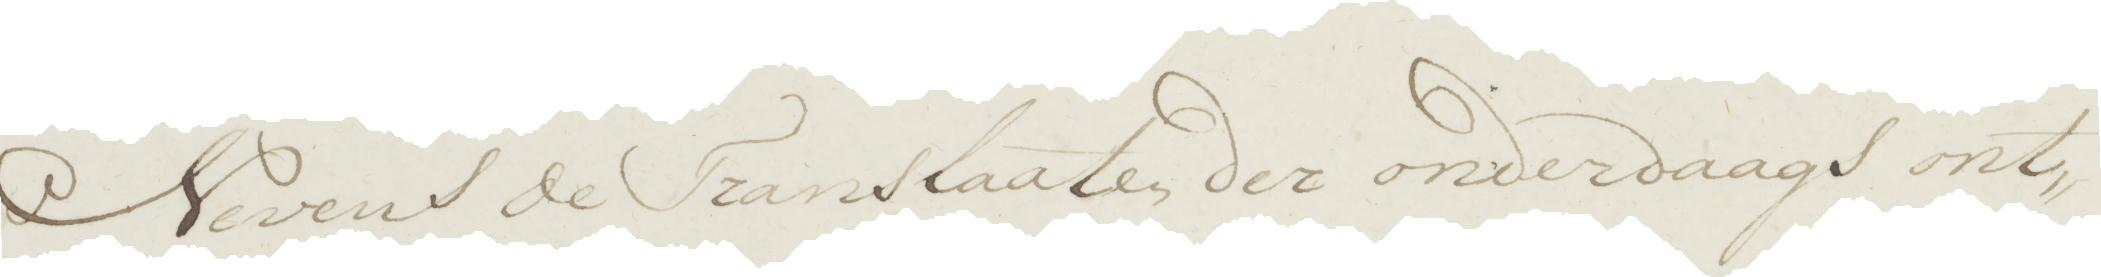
Nevens de Translaaten der onderdaags ont„
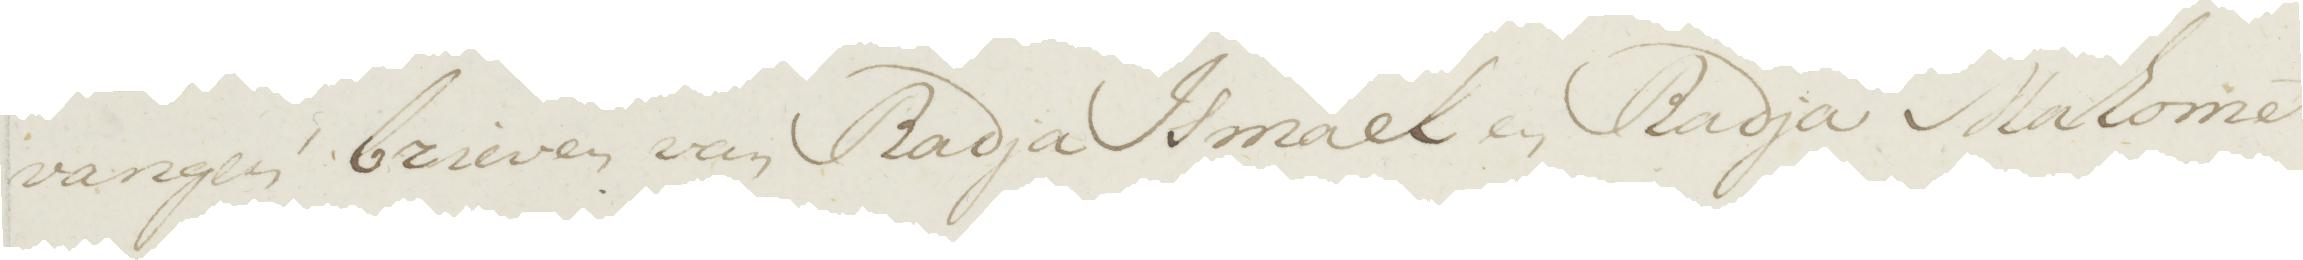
vangen brieven ven Radja Ismael en Radja Mahome
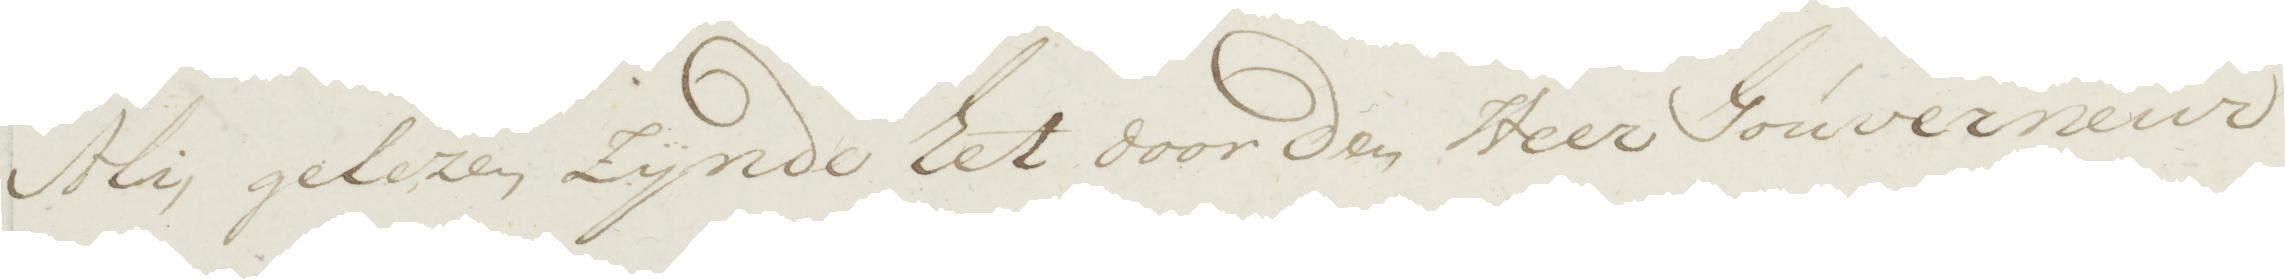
Ali, gelezen zijnde het door den Heer Gouverneur
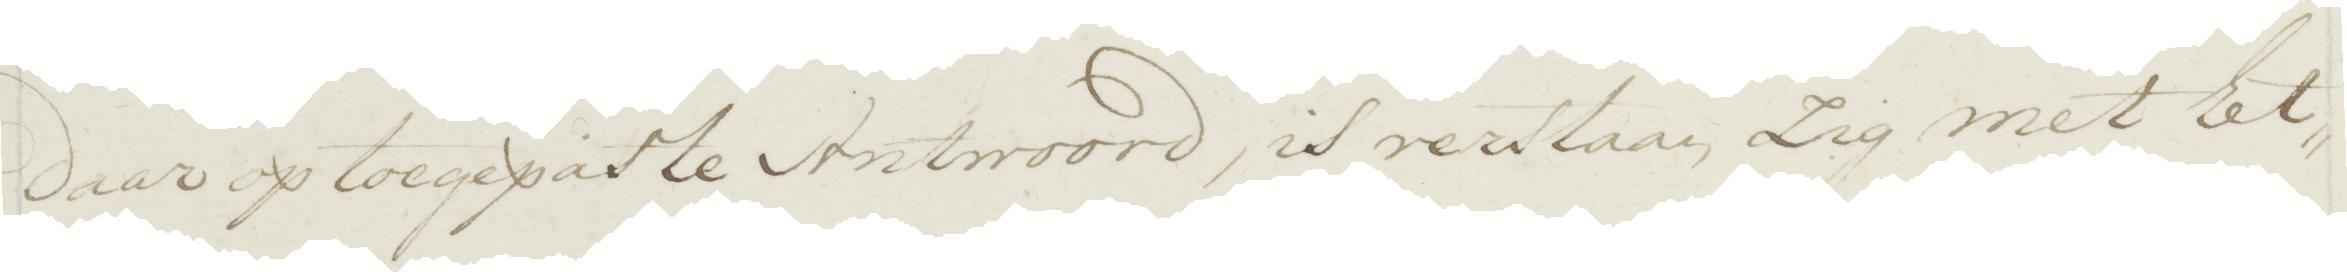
daar op toegepaste Antwoord, is verstaan zig met het„
